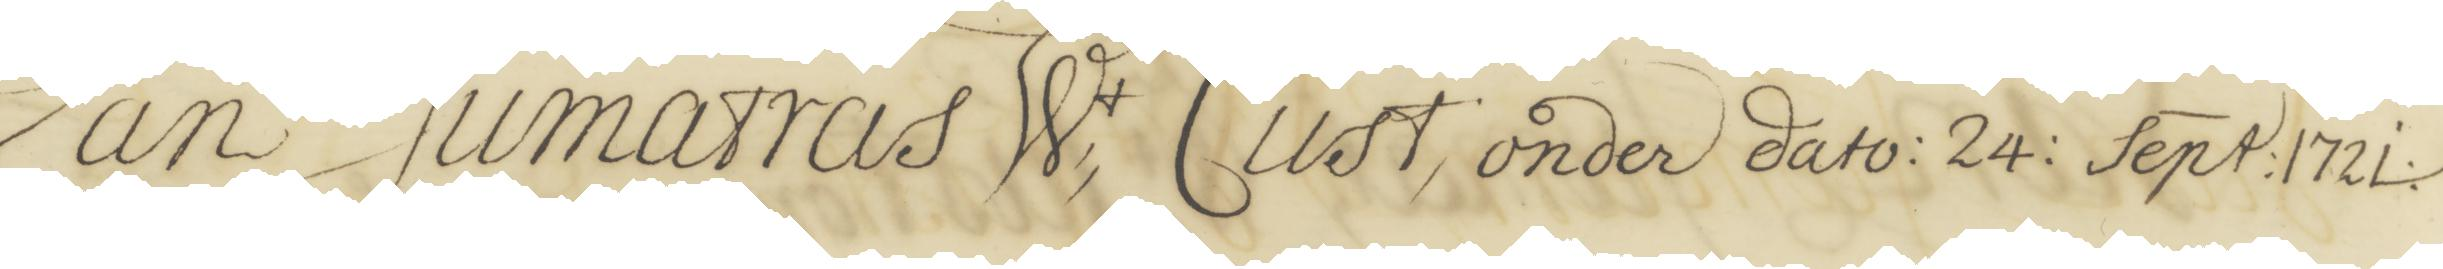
an Sumatras W„t Cust, onder dato: 24: en Sept: 1721:
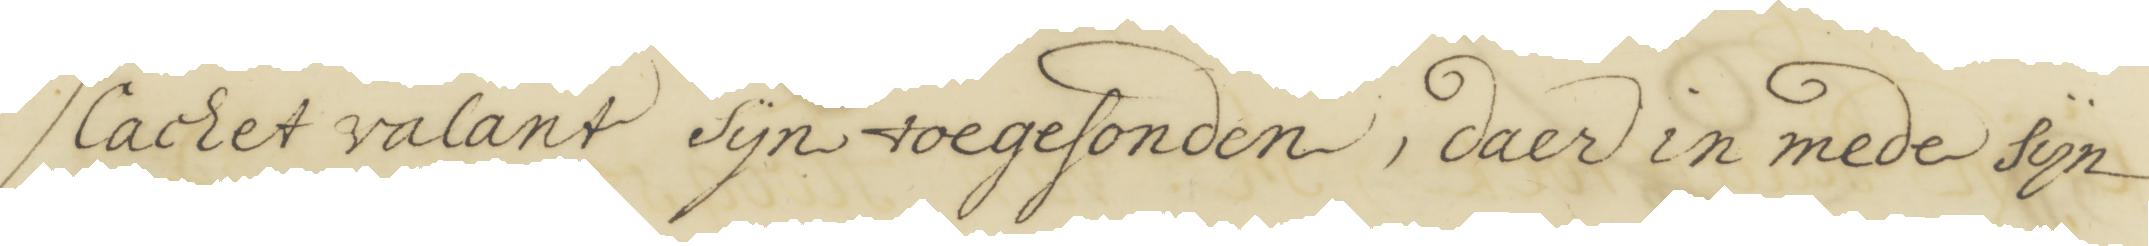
Cachet valant sijn toegesonden, daer in mede sijn
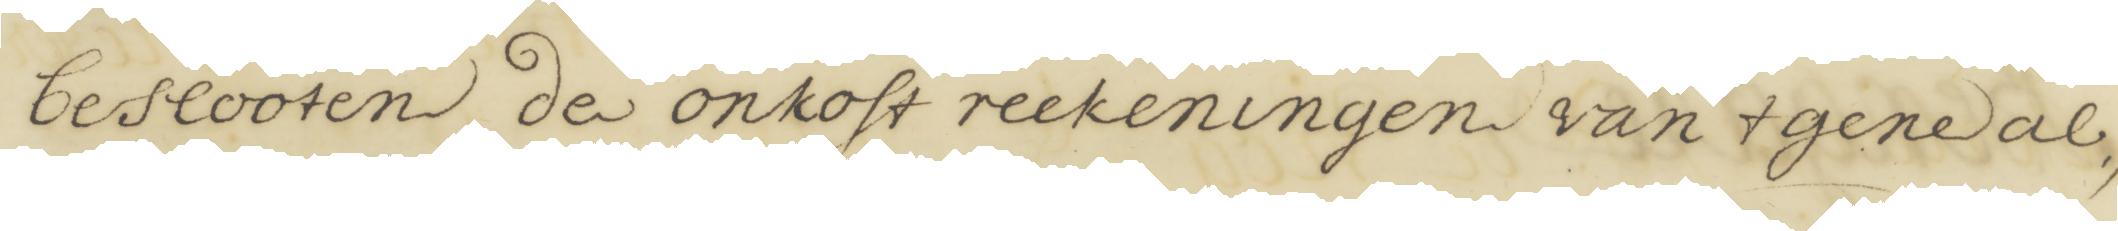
beslooten de onkost reekeningen van 't gene al„
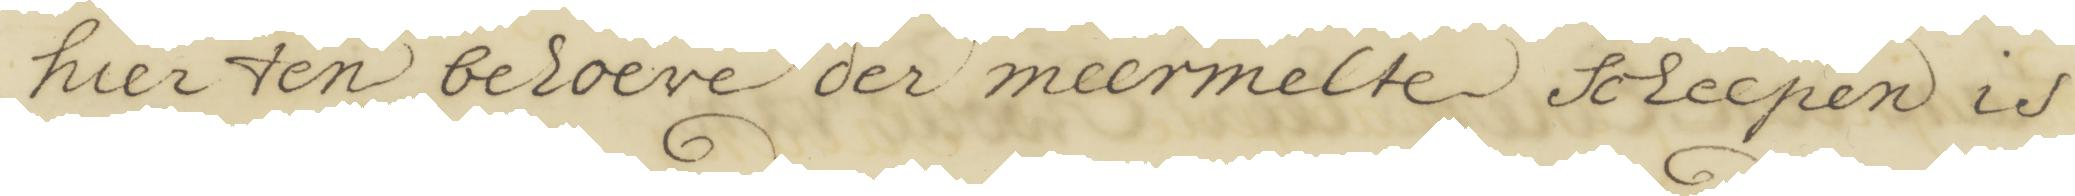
hier ten behoeve der meermelte scheepen is
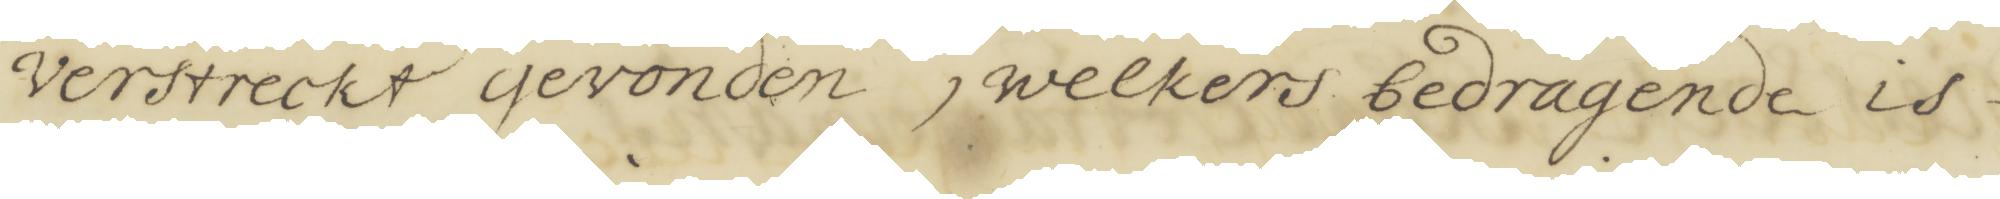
verstreckt gevonden, welkers bedragende is
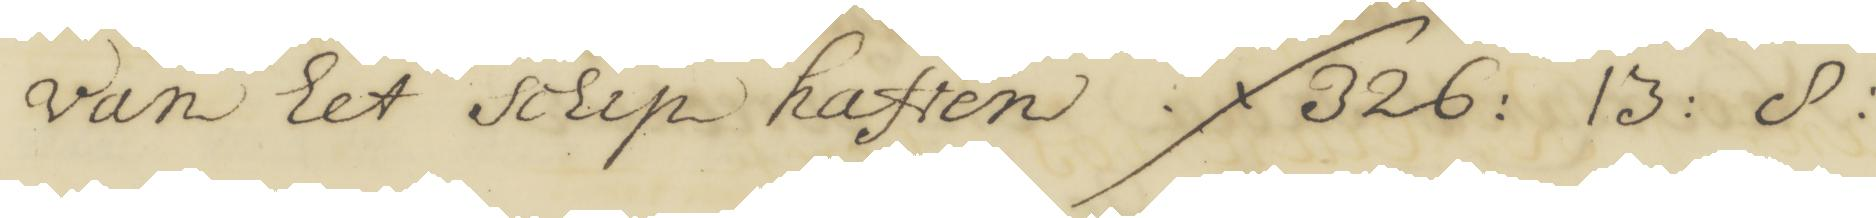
van het schip haften : ƒ326: 13: 8:
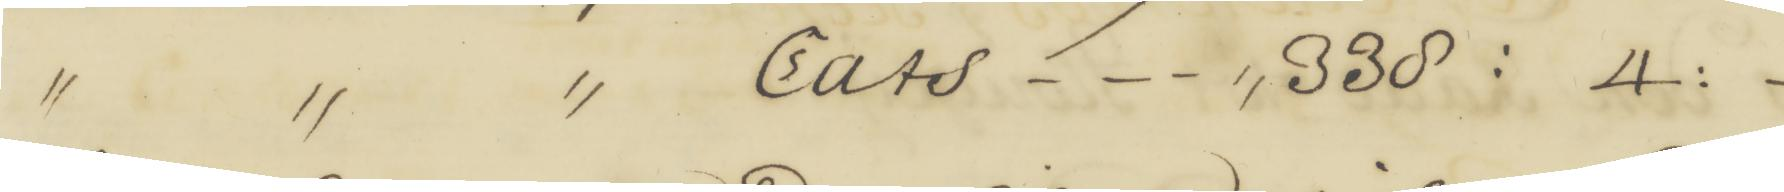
„ „ „ Cats – – – „ 338: 4:
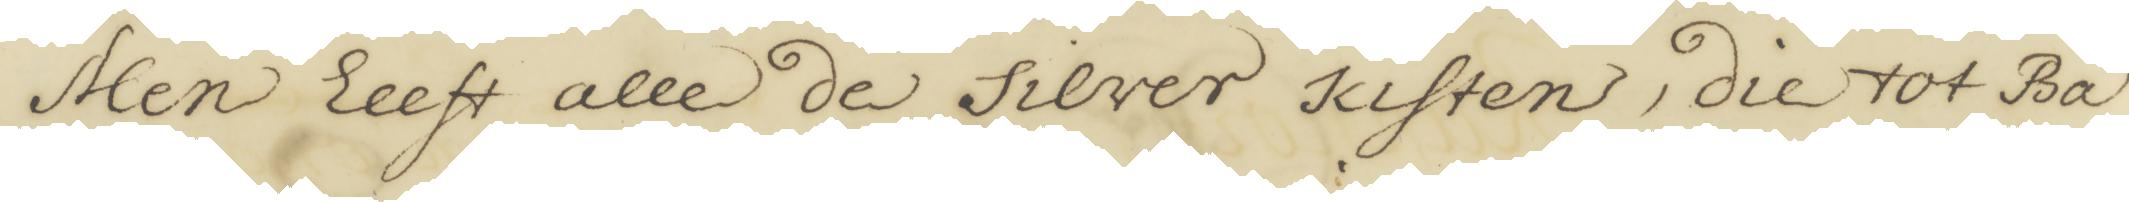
Men heeft alle de kisten, die tot Ba
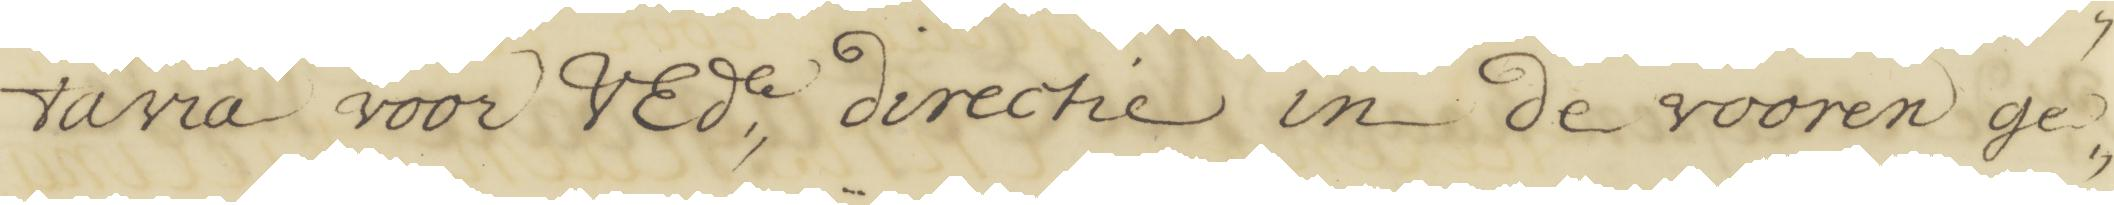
tavia voor UEd„le directie in de vooren ge„
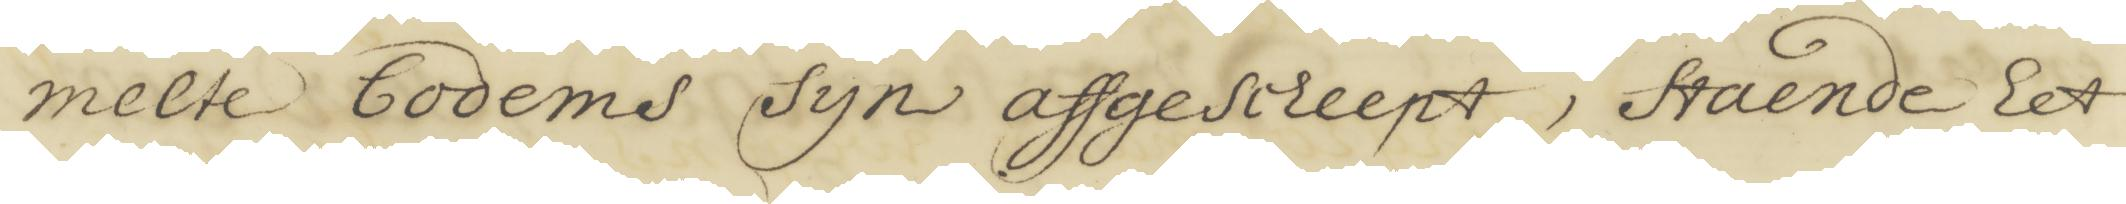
melte bodems sijn affgescheept, staende het
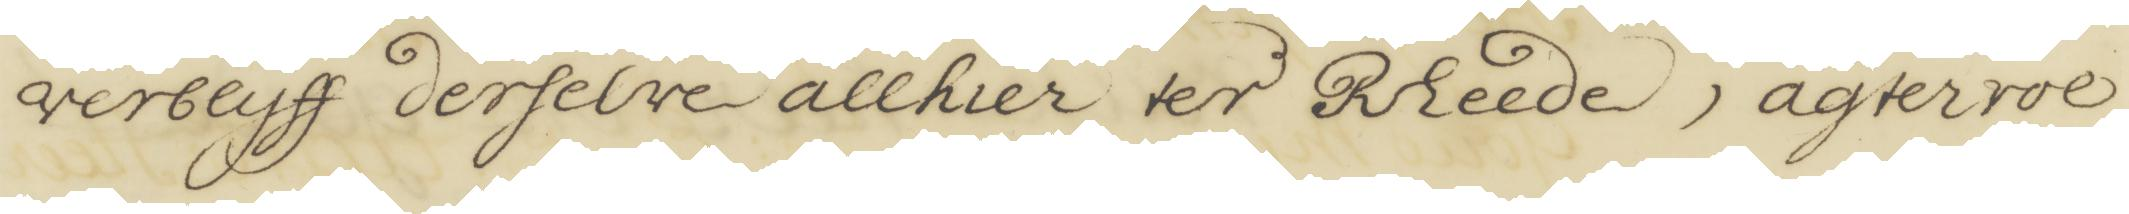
verblijff derselve allhier ter Rheede, agtervoe
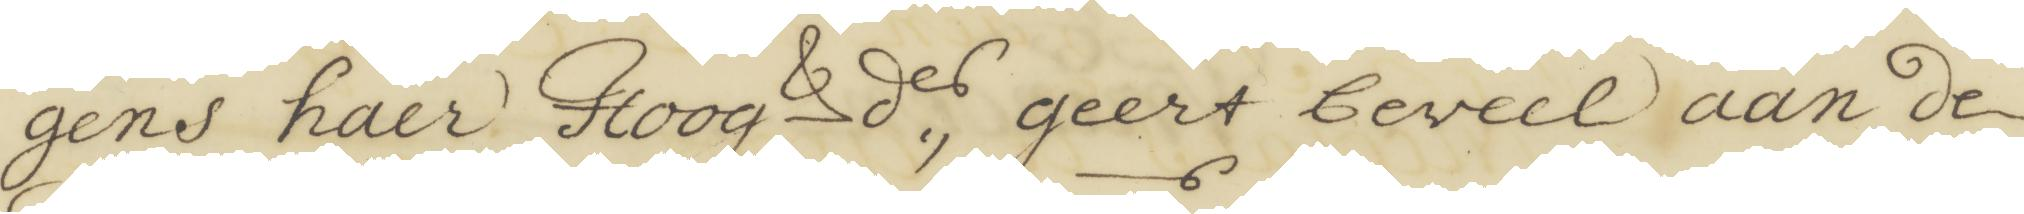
gens haer Hoog Ed„es geert beveel aan de
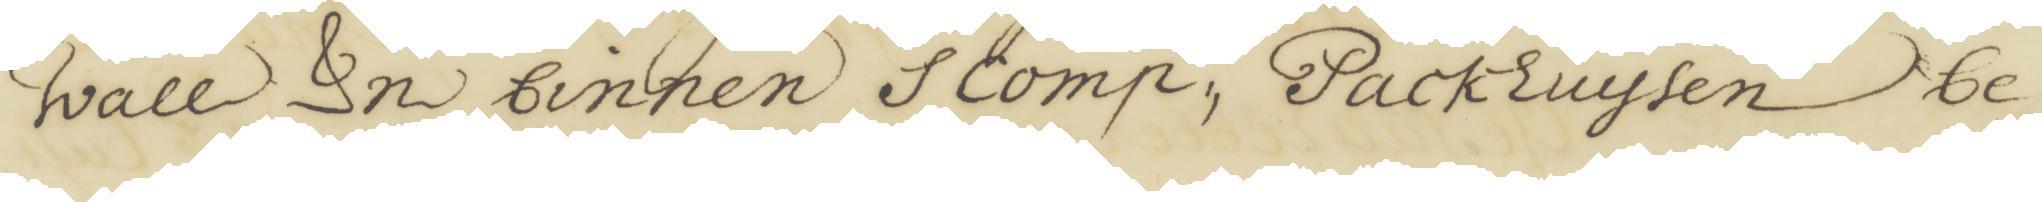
wall En binnen ’s Comp„s Packhuijsen be
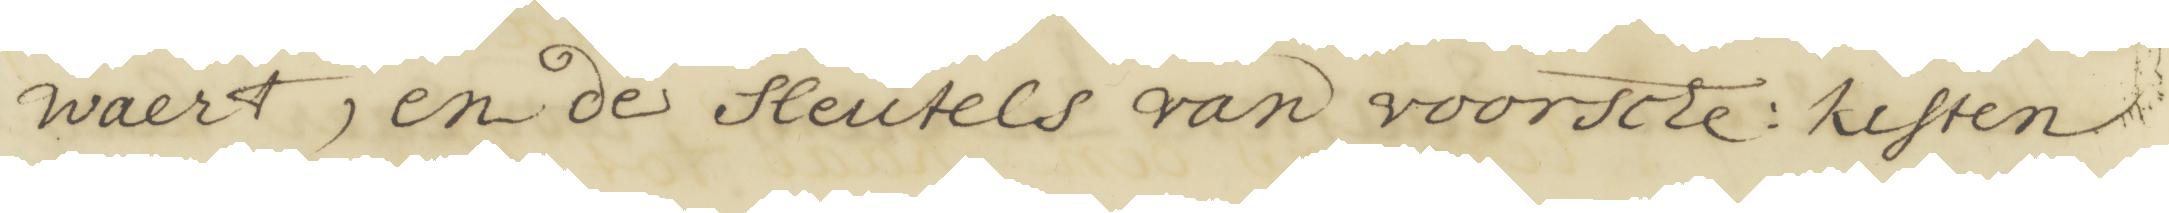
waert, en de sleutels van voorsche: kisten
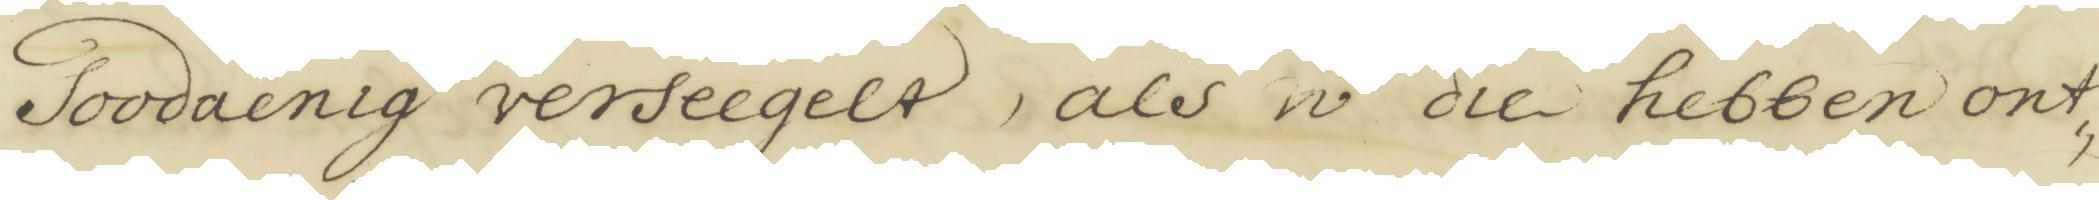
soodaenig verseegelt, als w' die hebben ont„
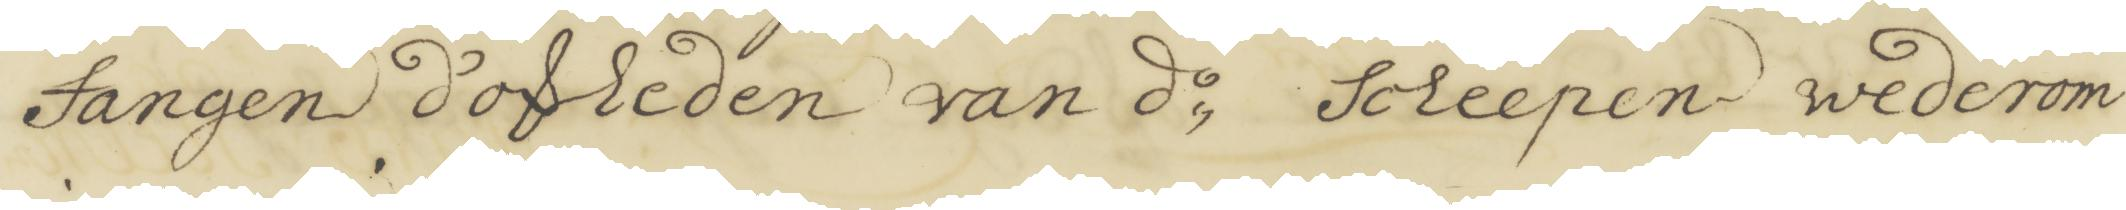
fangen d'overheden van d„o scheepen wederom
